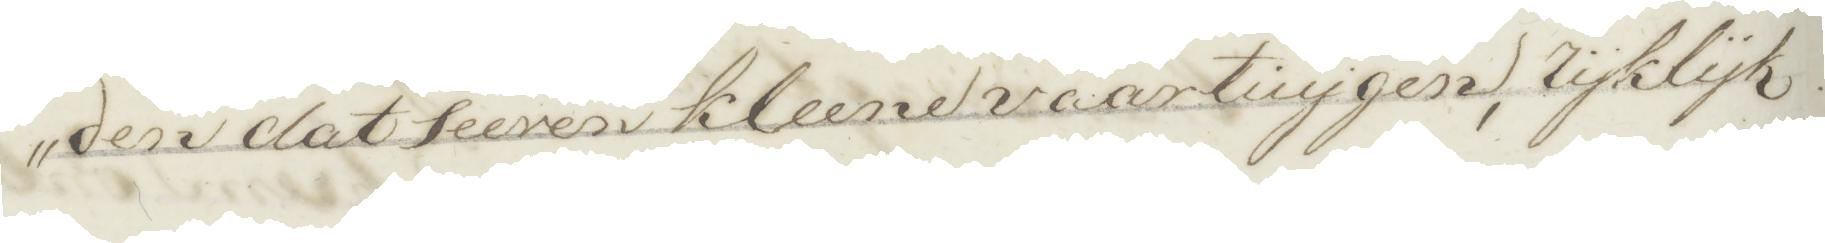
„den dat seeven kleene vaartuijgen, Rijklijk
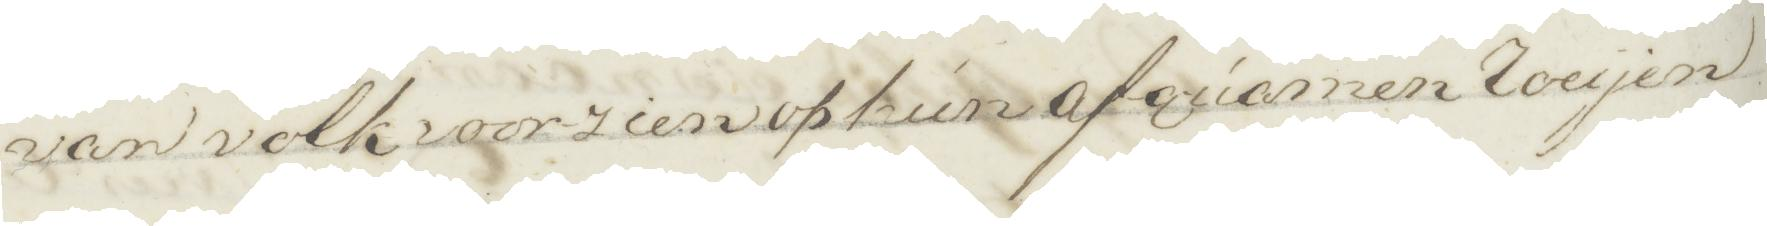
van volk voorzien op hun afquamen Roeijen
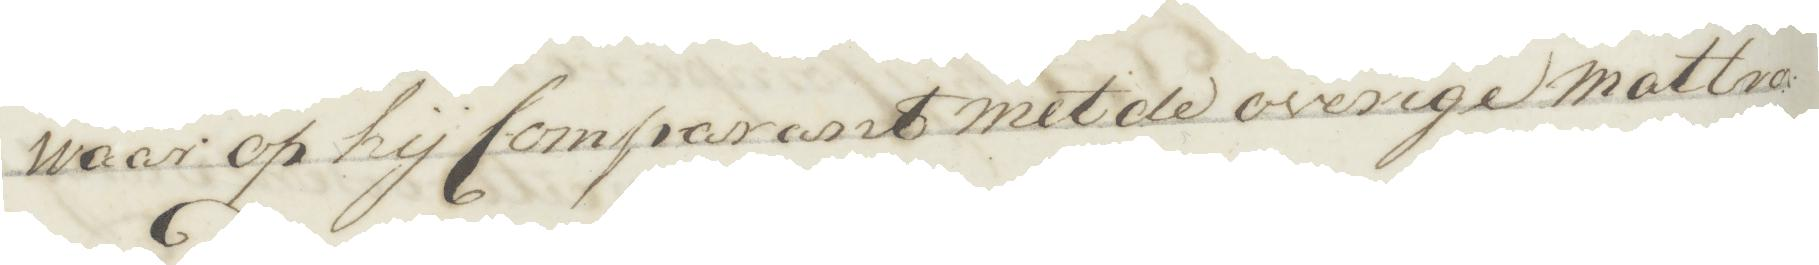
waar op hij Comparant met de overige mattro„
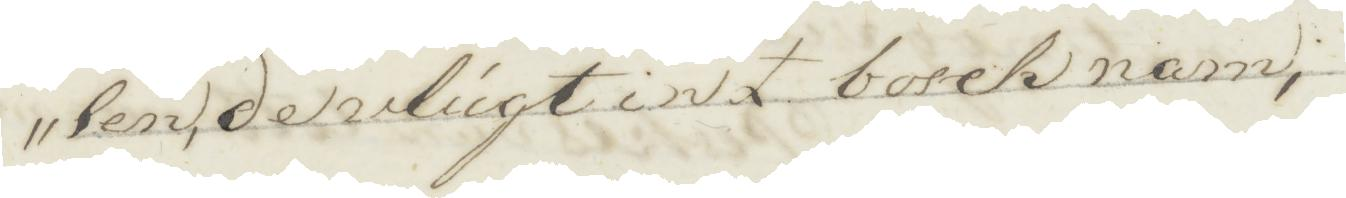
„sen, de vlugt in t bosch nam;
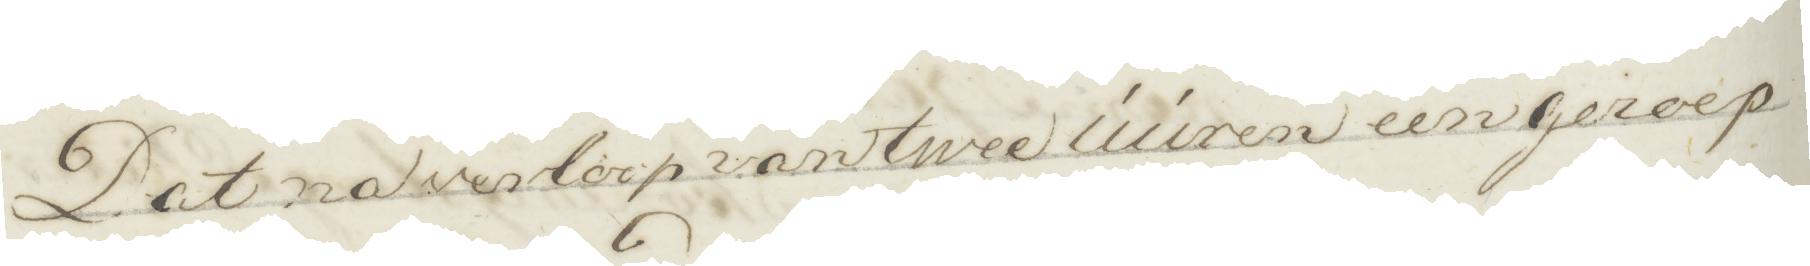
Dat na verloop van twee uuren een geroep
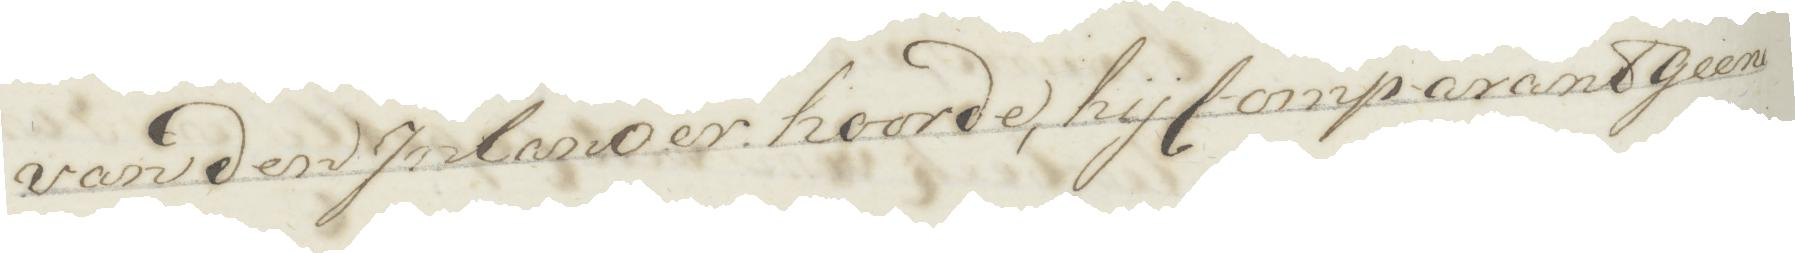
van den Jnlander hoorde, hij Comparant geen
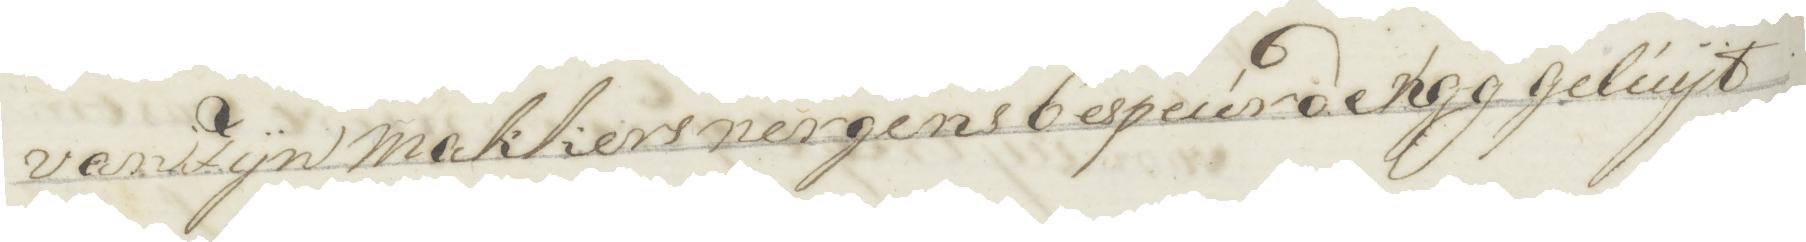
van Zijn makkers nergens bespeur de nog geluijt
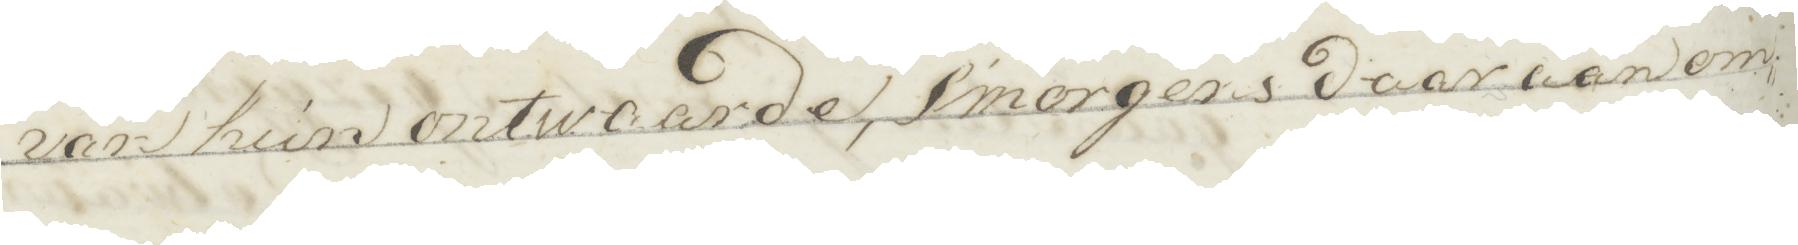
van hun ontwaarde, s'morgens daar aan om„
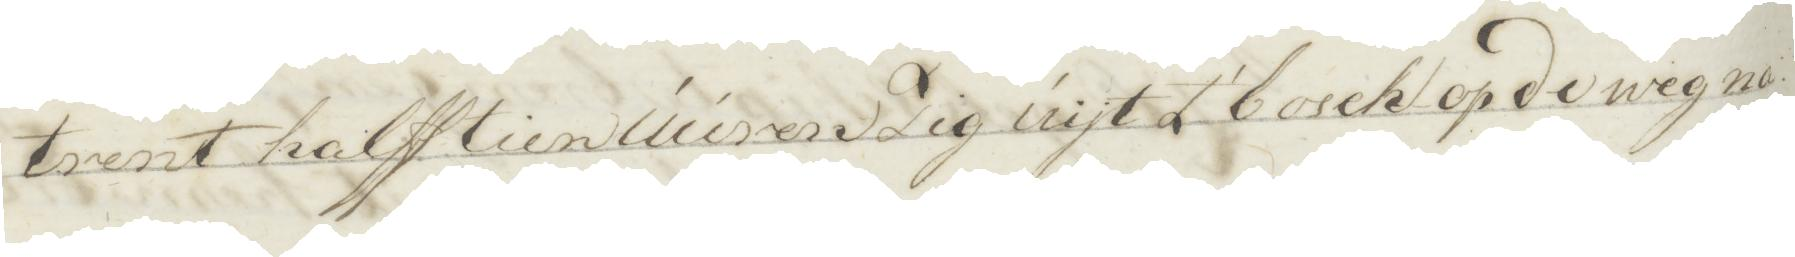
trent halfftien uuren Zig uijt t' bosch op de weg na
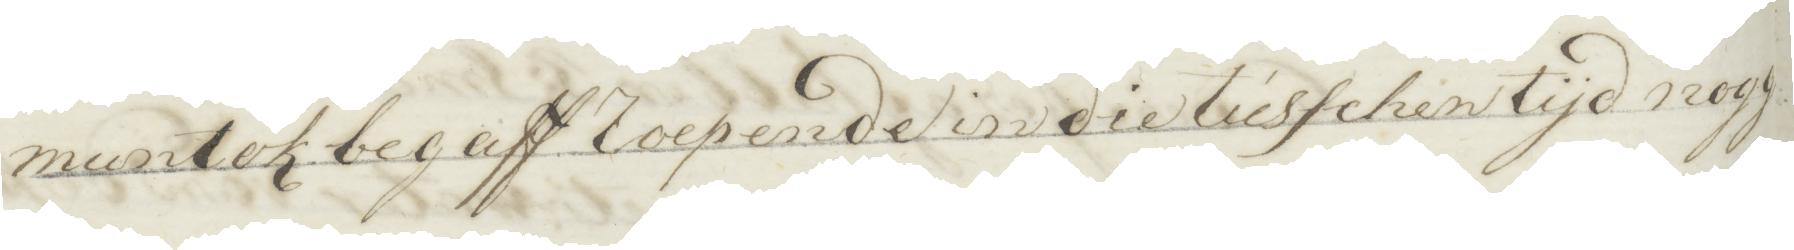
muntok begaff Roepende in die tusschen tijd nogg
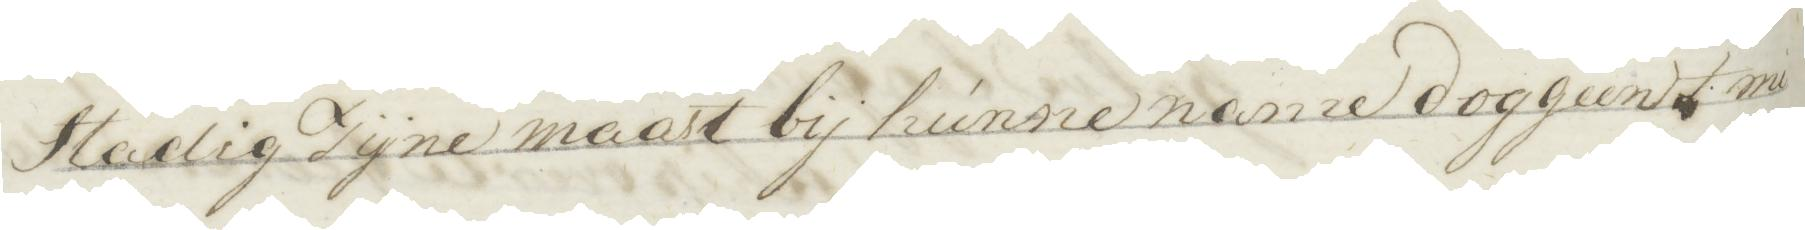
Staelig Zijne maast bij hunne name dog geen t mu
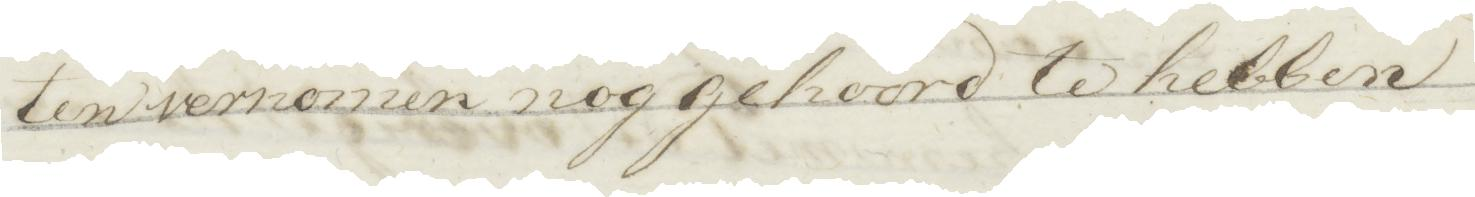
ten vernomen nog gehoord te hebben
